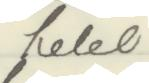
ketel
